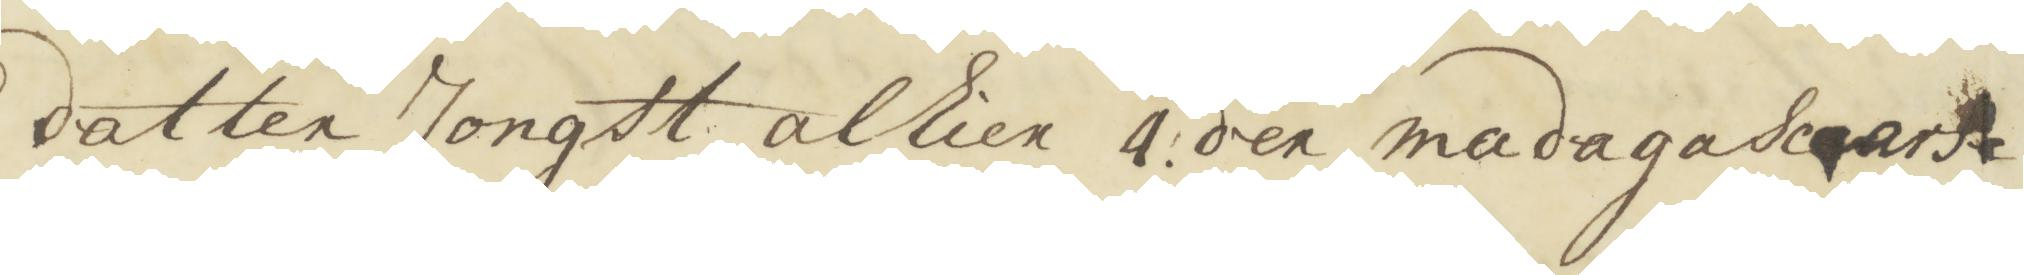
datter Jongst alhier 4: der madagascarse
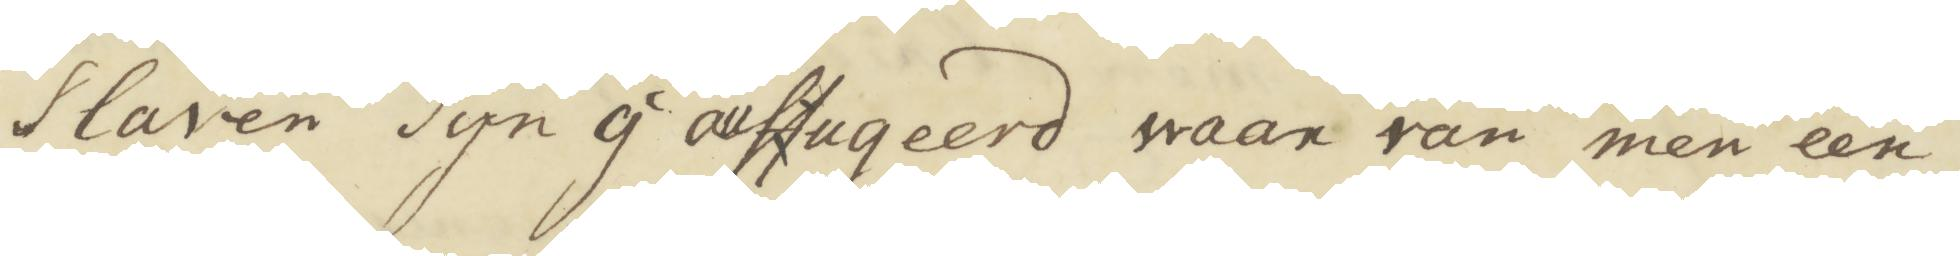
slaven sijn g’ausugeerd waar van men een
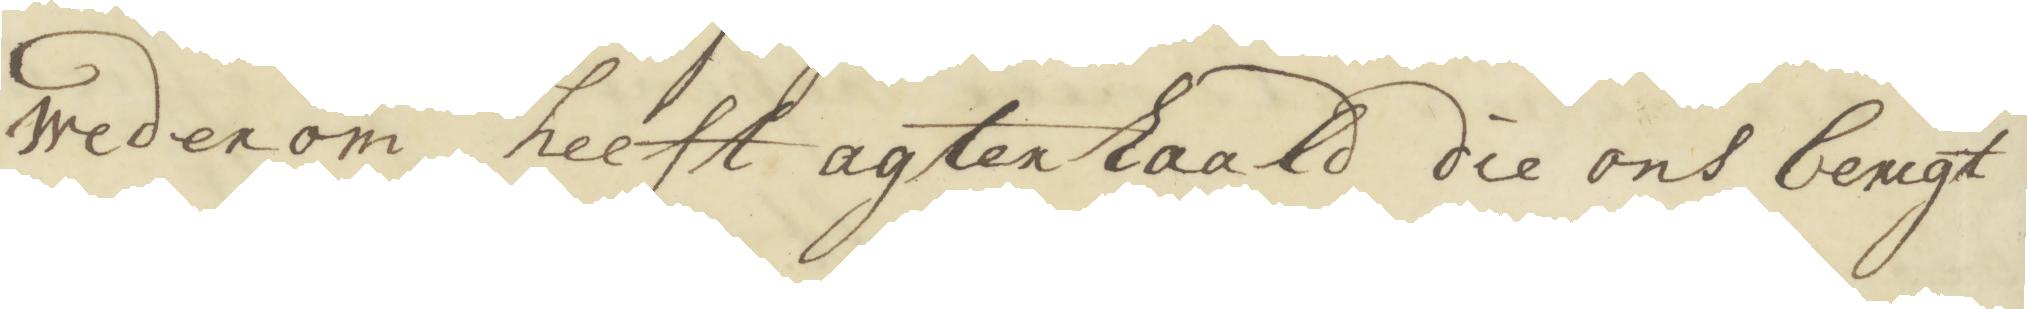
wederom heeft agterhaald die ons berigt
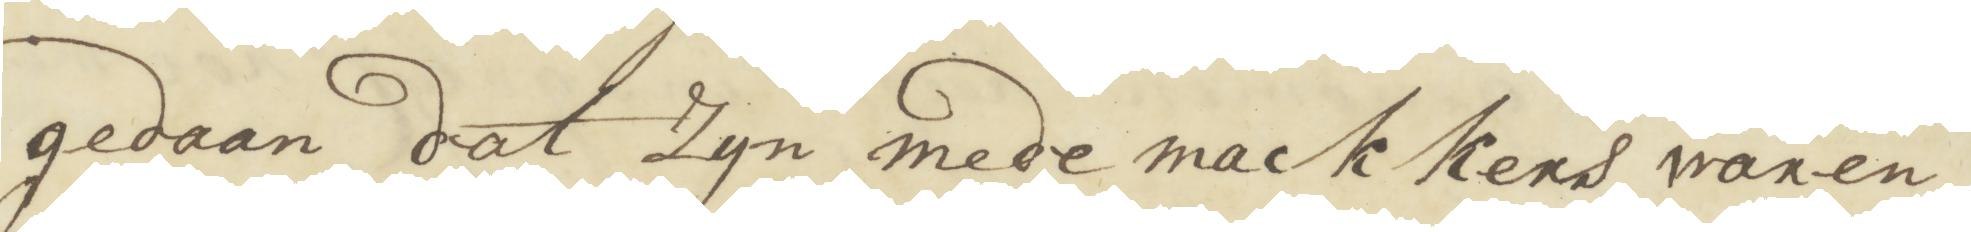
gedaan dat zyn mede mackkers waren
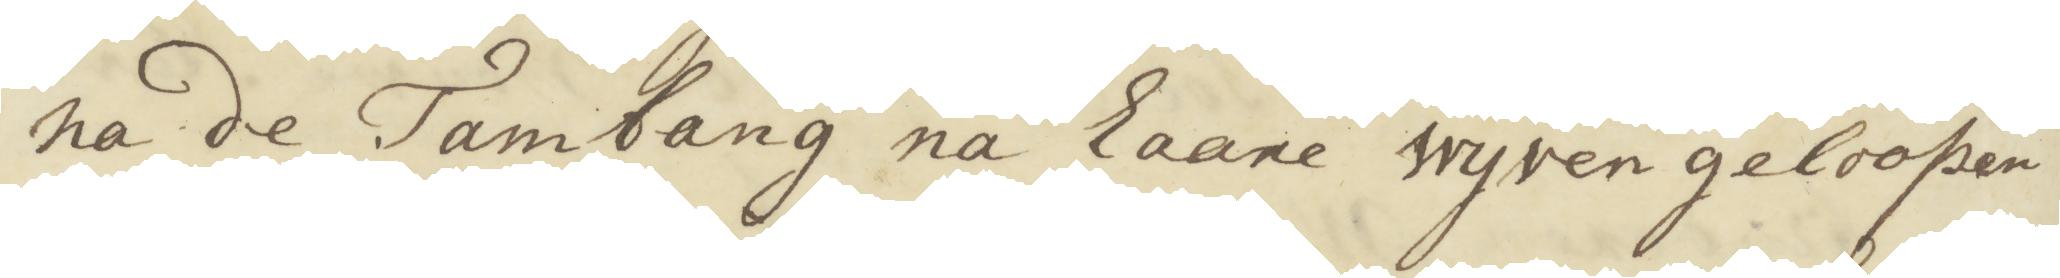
na de Tambang na haare wyven geloopen
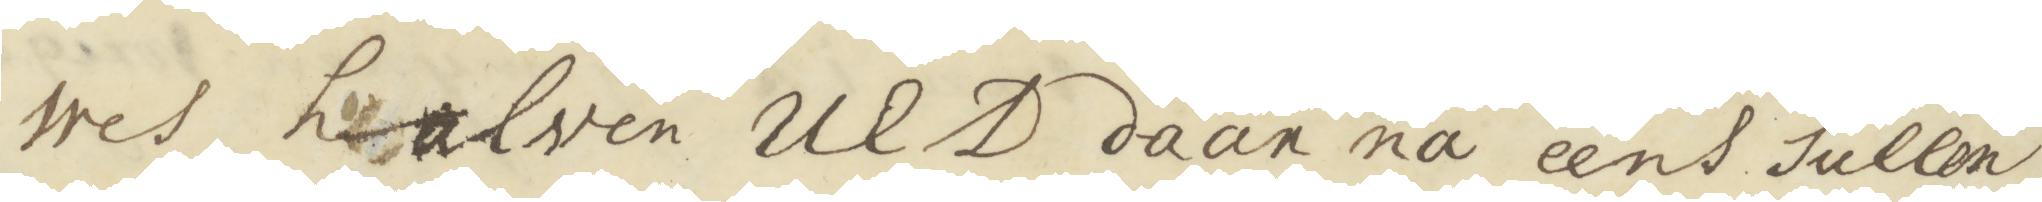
wes halven UE D daar na eens sullen
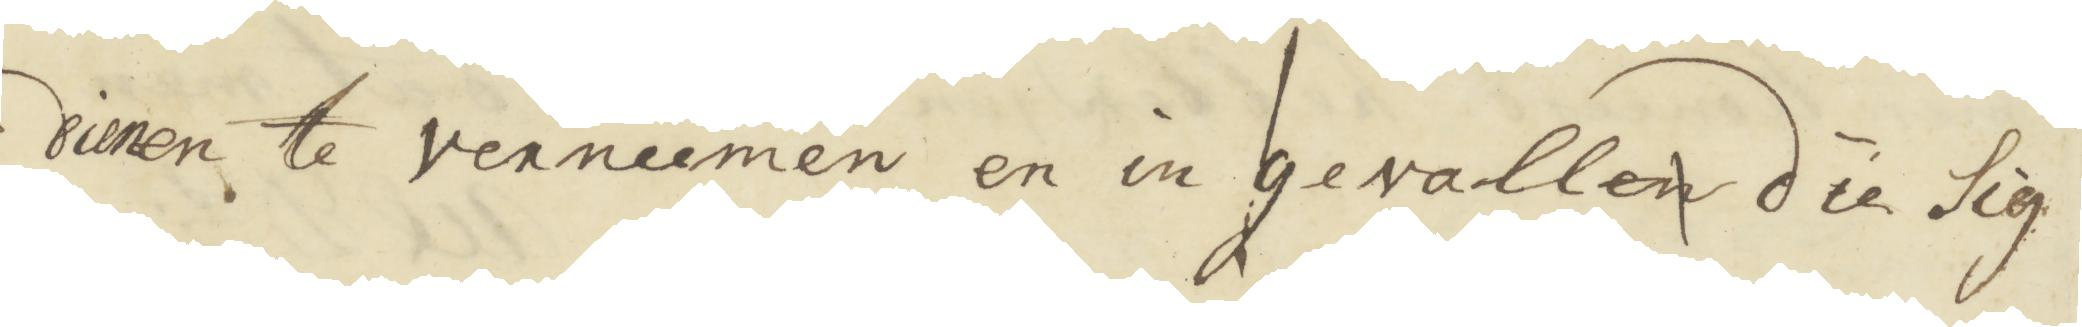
dienen te verneemen en in gevallen die sig
